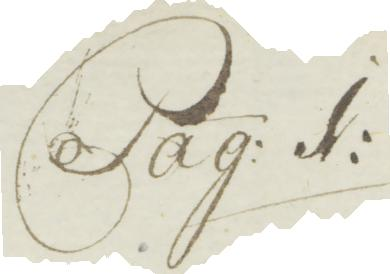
Pag: 1:
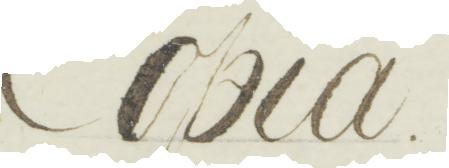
Copia.
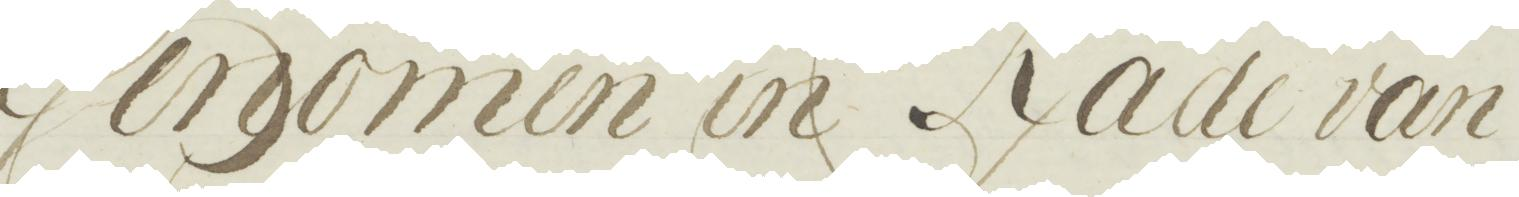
Genomen in Rade van
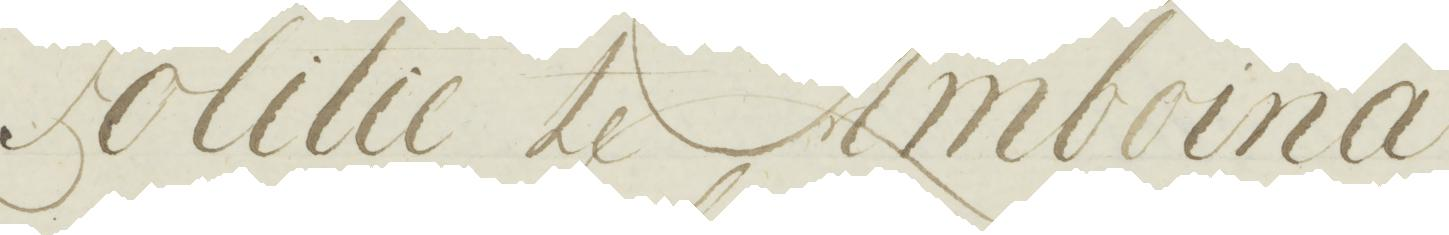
Politie te Amboina
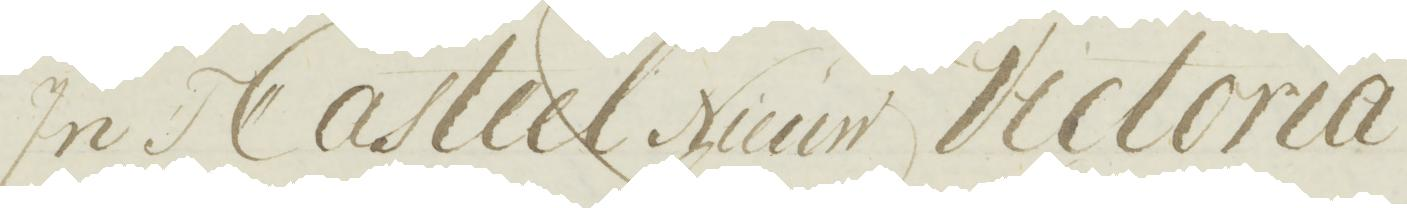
Jn 'T Casteel Nieuw Victoria
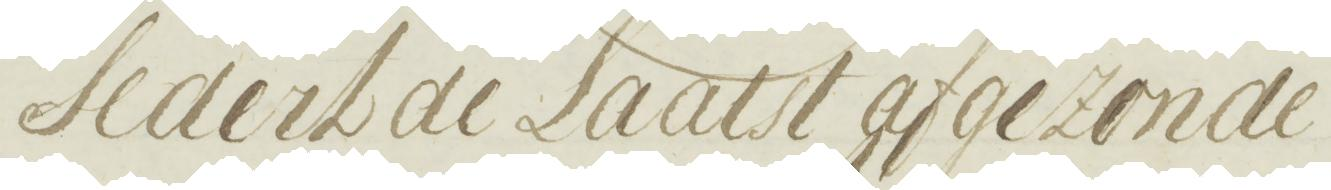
sedert de Laatst afgezonde
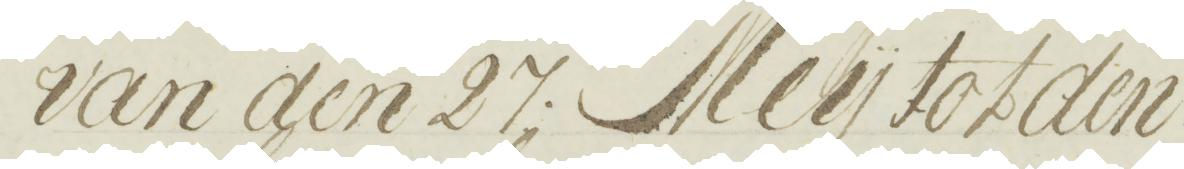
van den 27:' Meij tot den
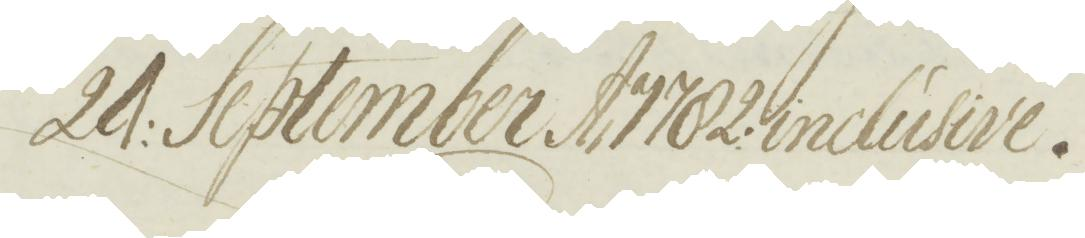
24: September A„o1782: inclusive.
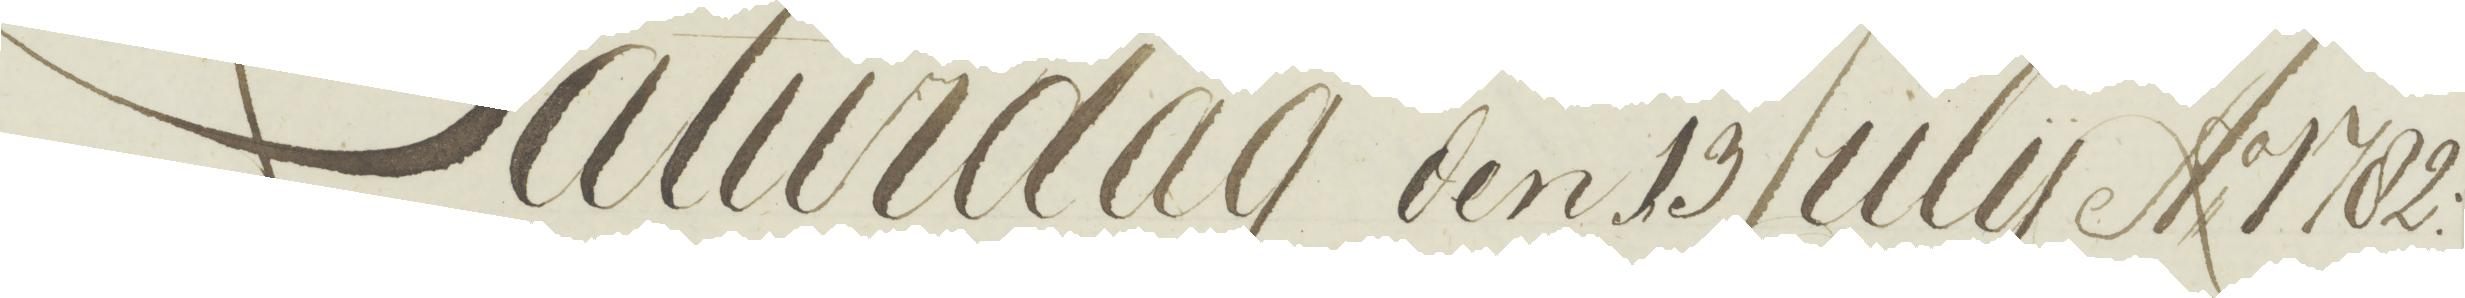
Saturdag den 13 Julij A„o 1782.
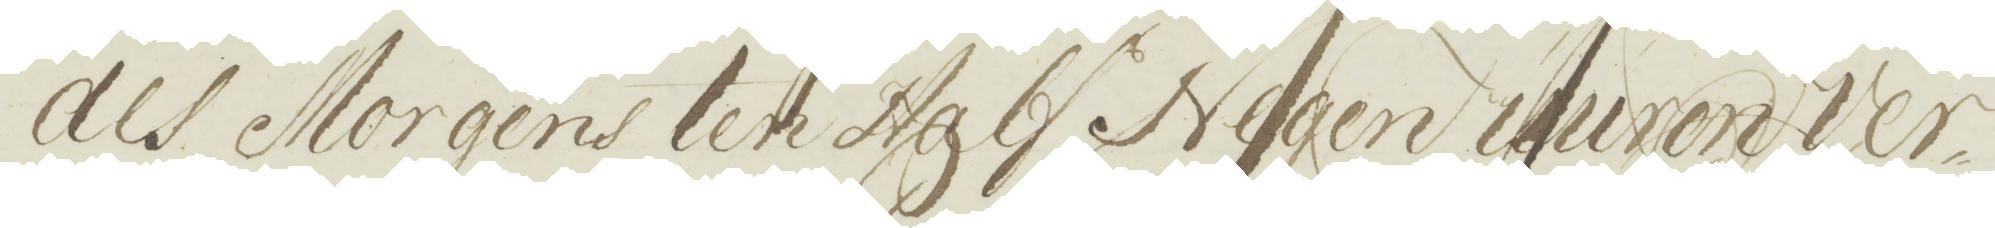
des Morgens ten Half Negen uuren ver„
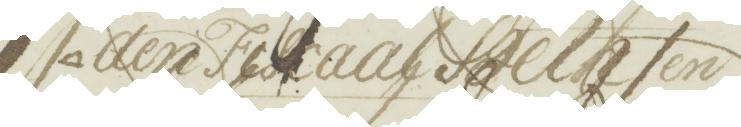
^den Fiscaal Beth en
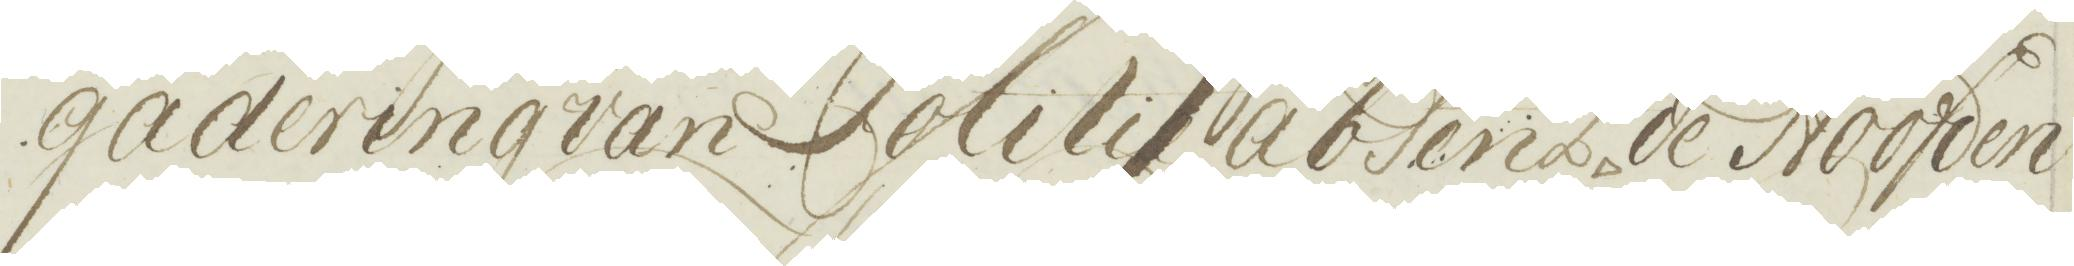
gadering van Politie, absent ^ de Hoofden
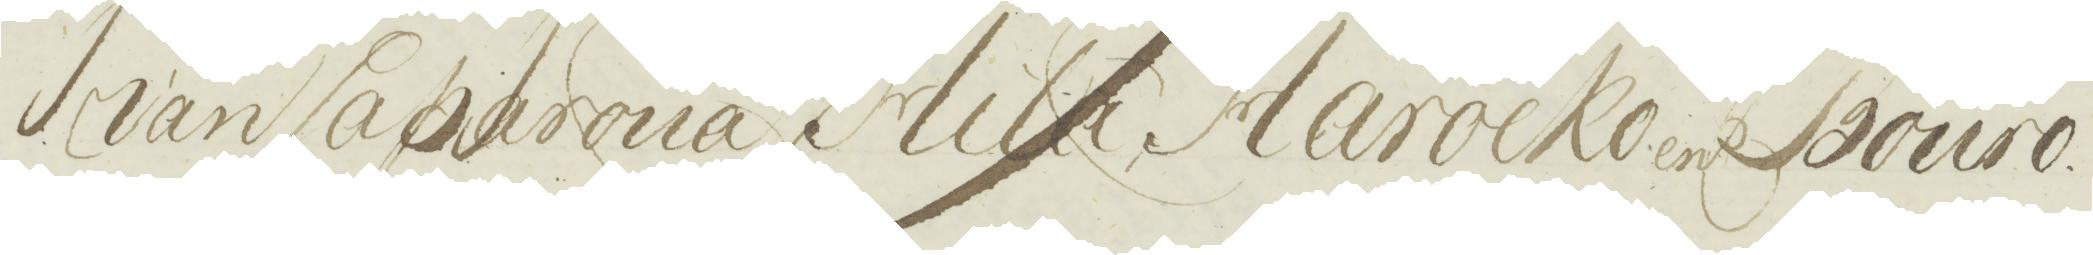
van Japaroua, Hila, Haroeko en Bouro.
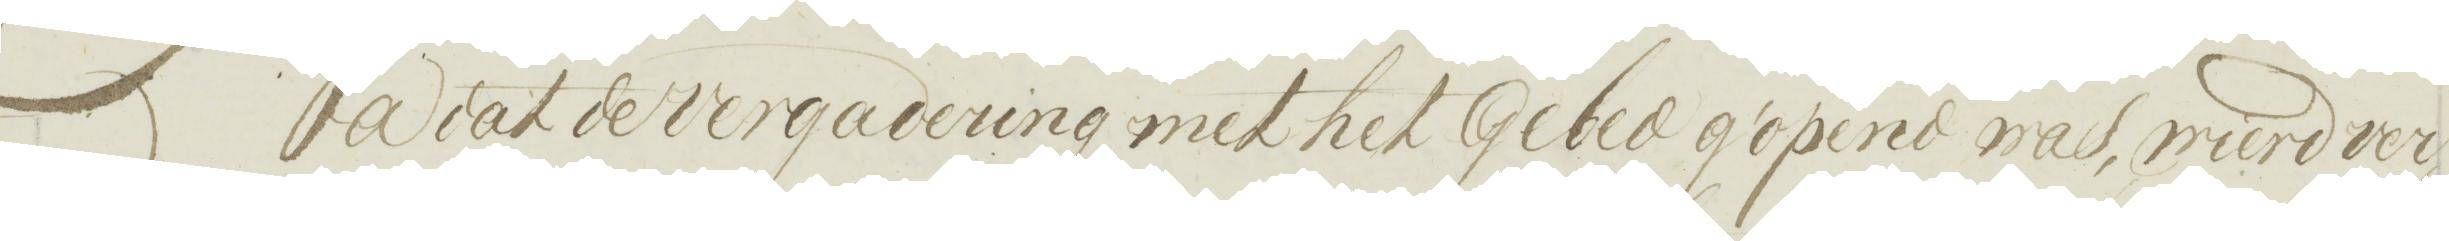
Na dat de vergadering met het Gebed g'opend was, wierd ver„
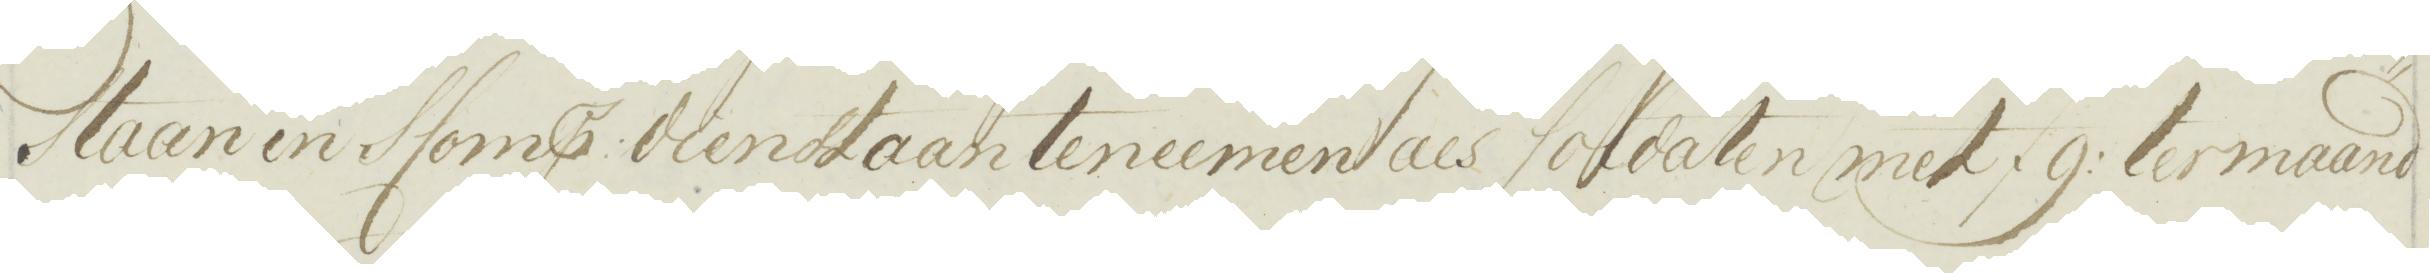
staan in sComp:s dienst aan teneemen als soldaten met ƒ 9: termaand
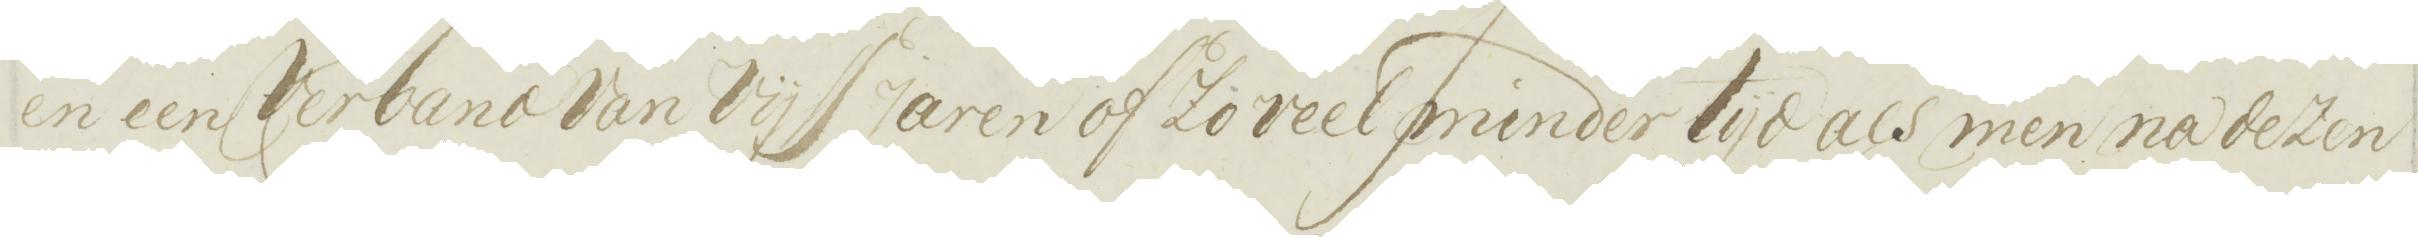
en een verband van vijf jaren of zo veel minder tijd als men na dezen
